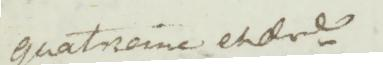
quatrième et dr=e
